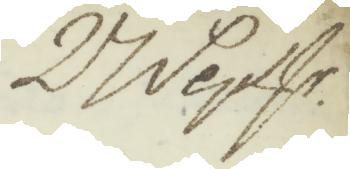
27 Septbr.
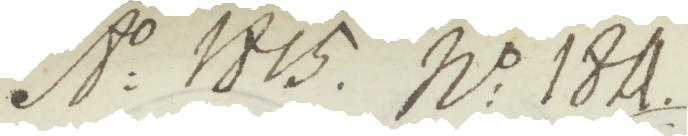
A:o 1815. N:o 184.
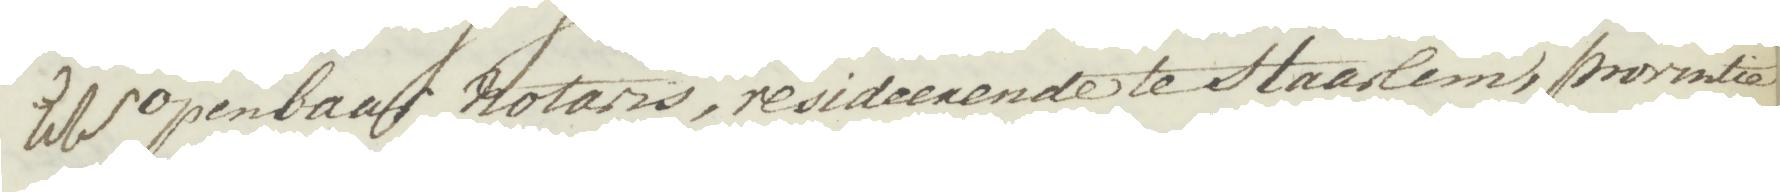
Edls openbaar notaris, resideerende te Haarlem, provintie
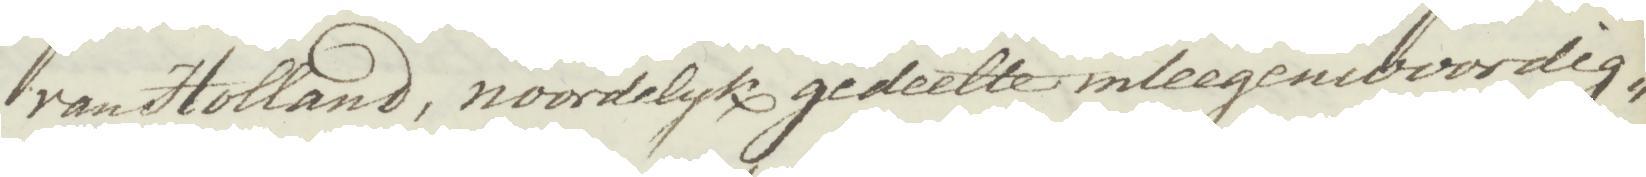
van Holland, noordelijk gedeelte, inteegenwoordig„
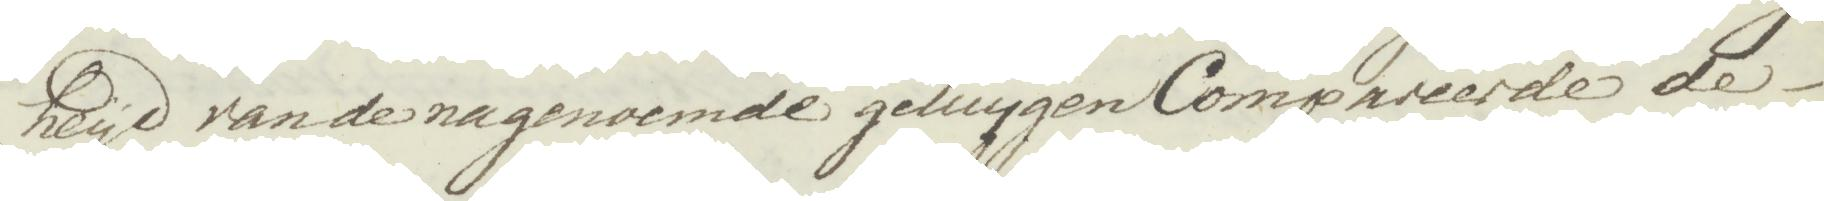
heijd van de nagenoemde getuijgen Compareerde de
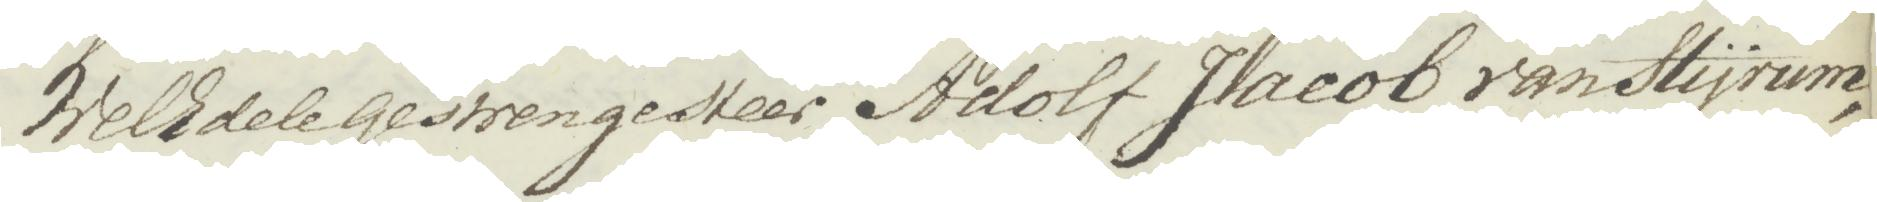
Wel Edele gestrenge Heer Adolf Jacob van Stijrum,
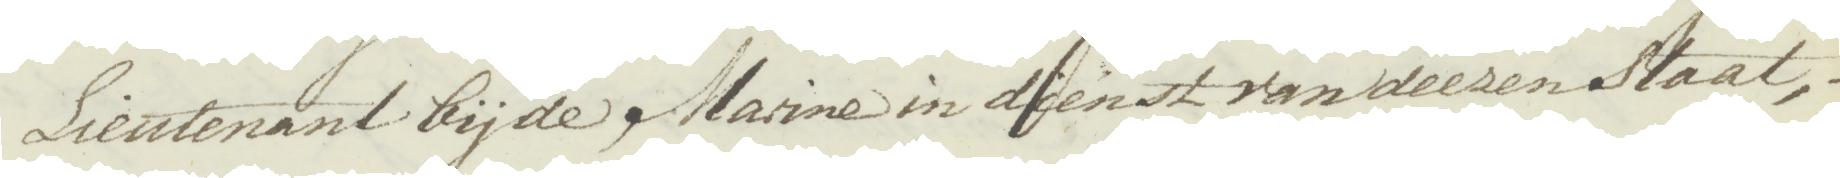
Lieutenant bij de Marine in dienst van deezen staat,
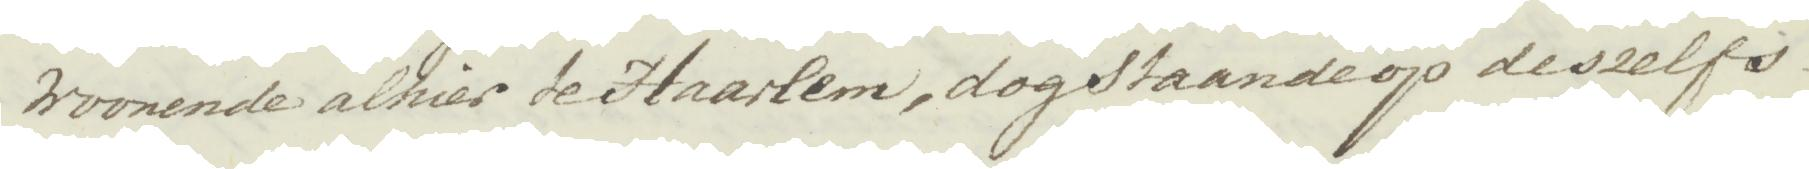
woonende alhier de Haarlem, dog staande op deszelfs
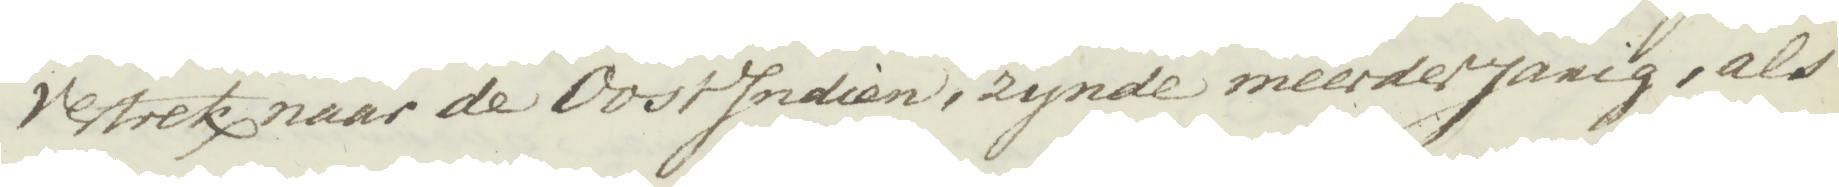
vertrek naar de Oost Indien, zynde meerderjarig, als
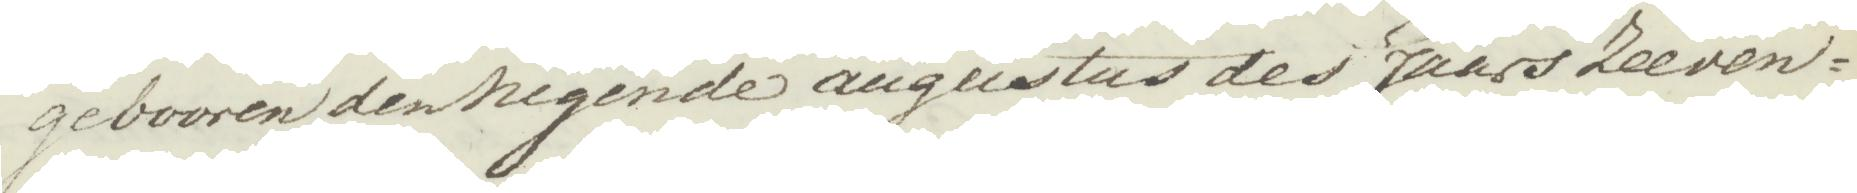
gebooren den negende augustus des Jaars zeeven=
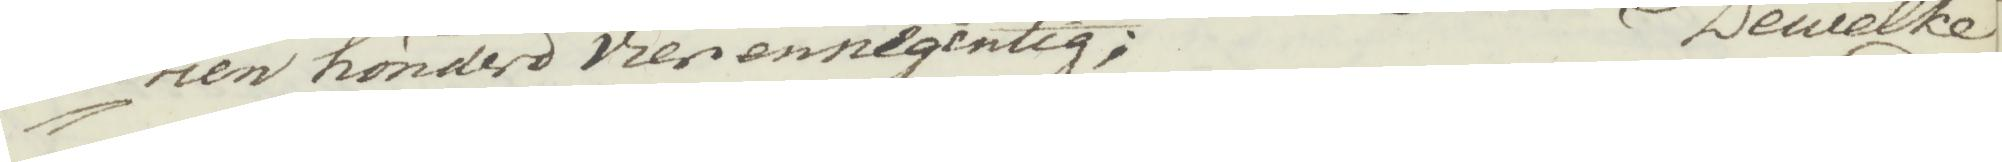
„tien honderd vierennegentig; Dewelke
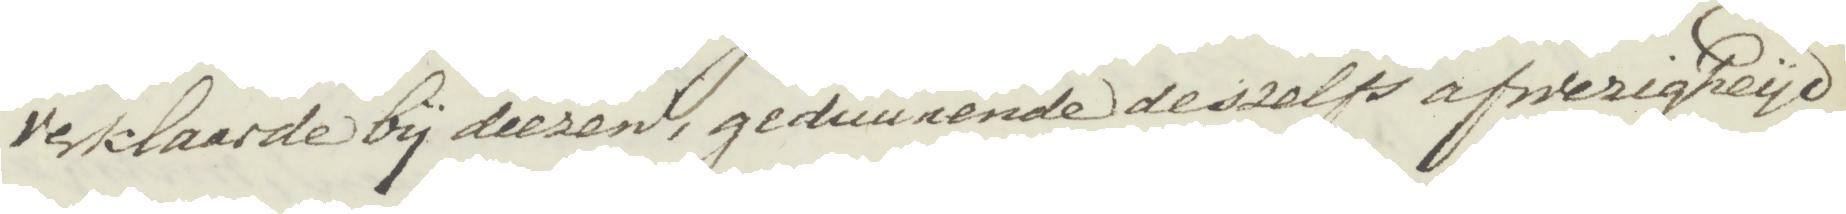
verklaarde bij deezen, geduurende deszelfs afwezigheijd
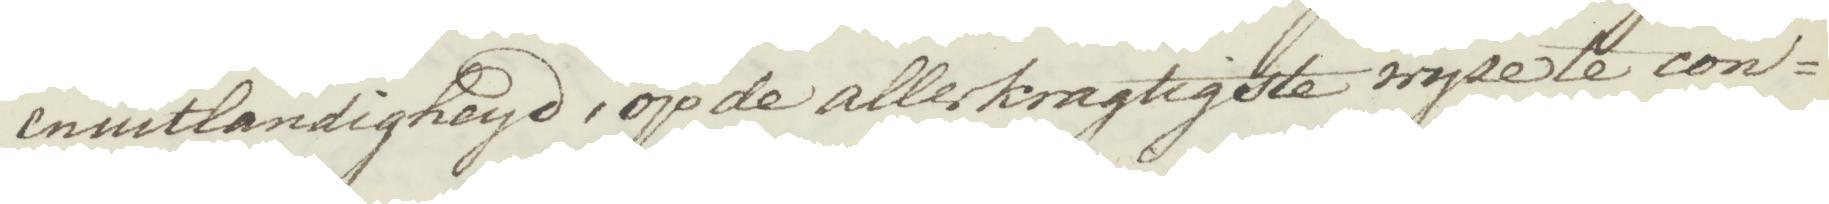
en uitlandigheyd, op de aller kragtigste wyze te con=
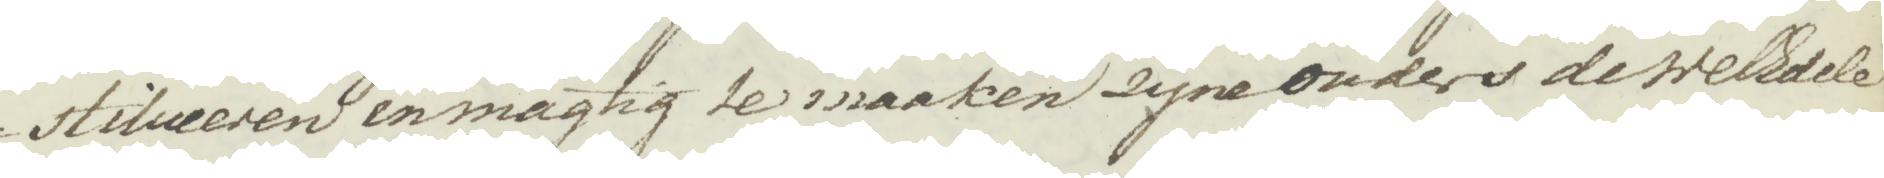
stitueeren en magtig te maaken zijne orders de wel Edele
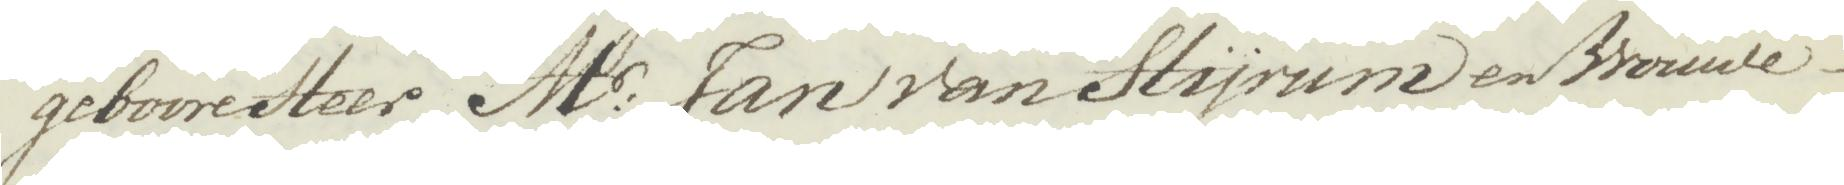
geboore Heer M:r Jan van Stijrum en Vrouwe
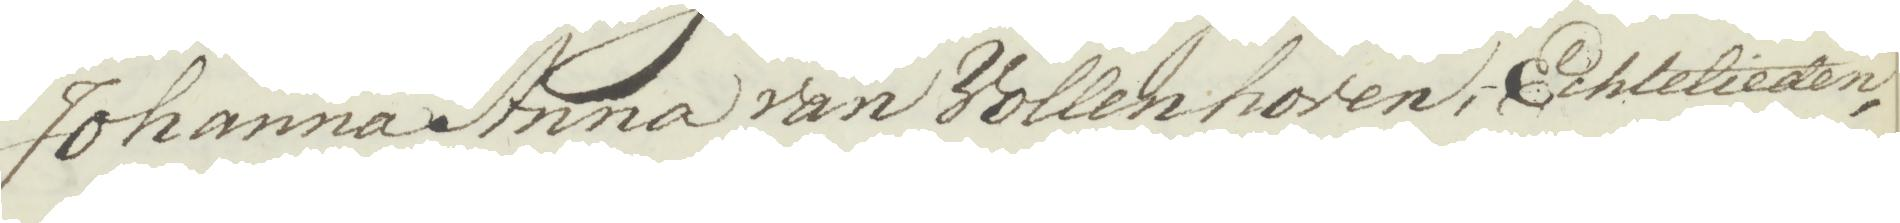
Johanna Anna van Vollenhoven: Echtelieden,
